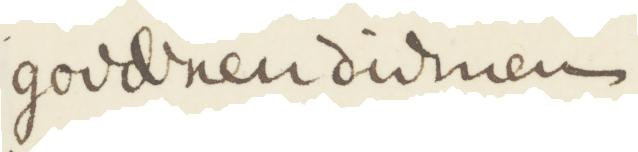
goederen die men
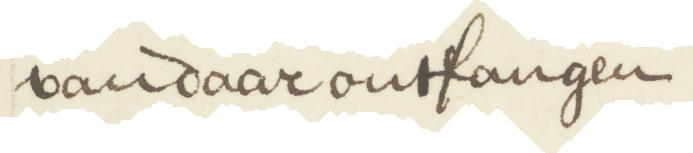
van daar ontfangen
